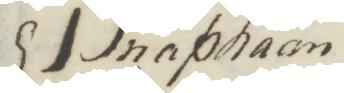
1 Snaphaan
